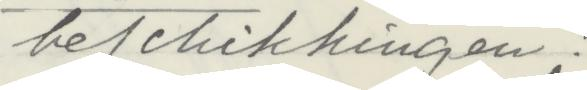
beschikkingen
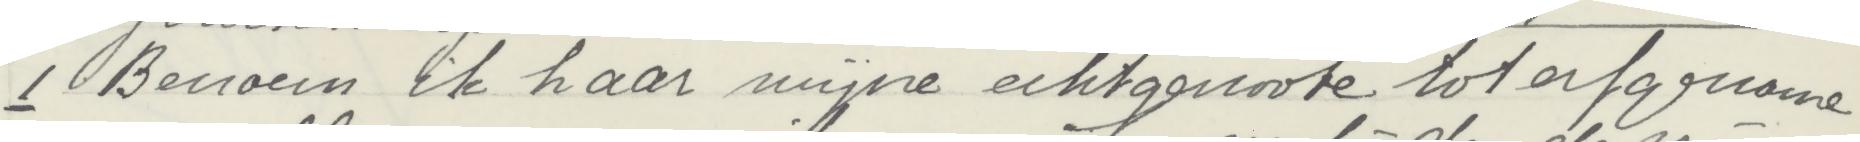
1 Benoem ik haar mijne echtgenoote tot erfgename
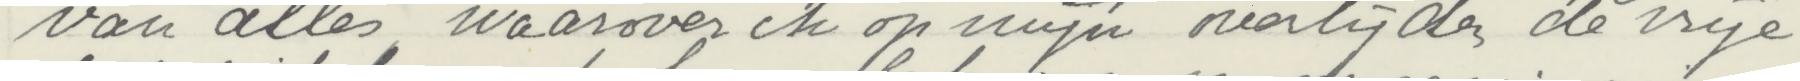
van alles waarover ik op mijn overlijden de vrije
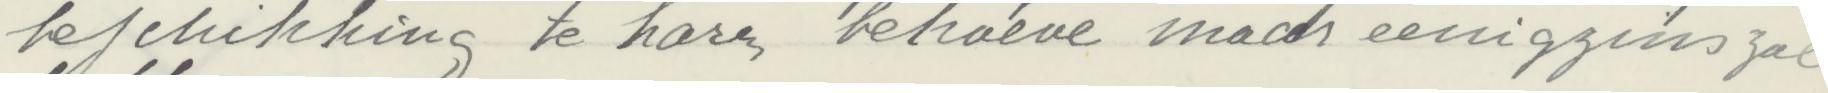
beschikking te haren behoeve maar eenigzins zal
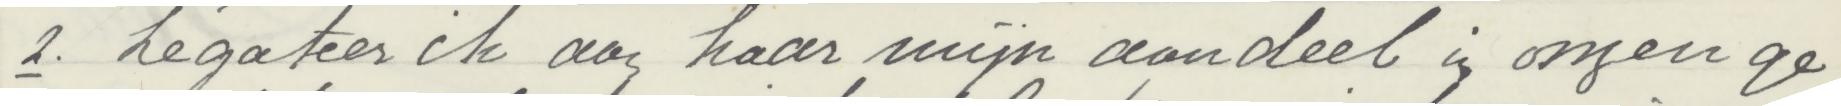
2. Legateer ik aan haar mijn aandeel in onzen ge
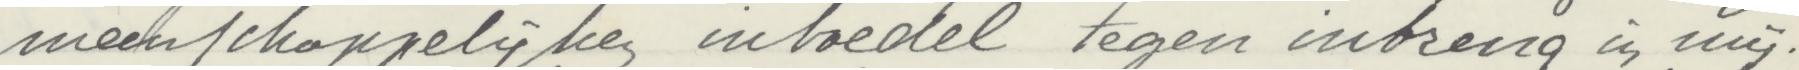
meenschappelijken inboedel tegen inbreng in mij
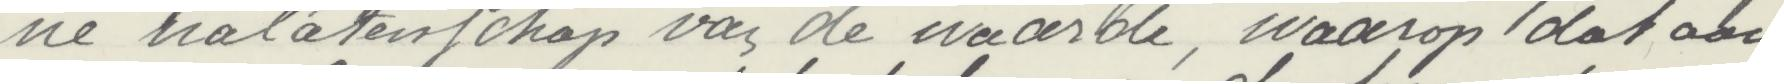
ne nalatenschap van de waarde, waarop dat aan
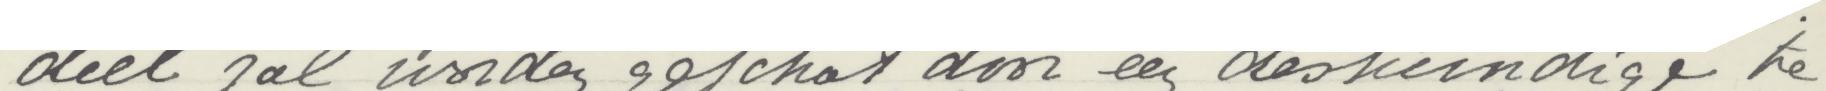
deel zal worden geschat door een deskundige te
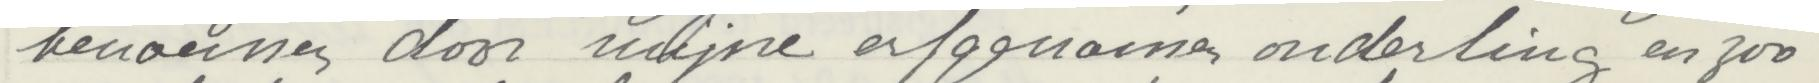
benoemen door mijne erfgenamen onderling en zoo
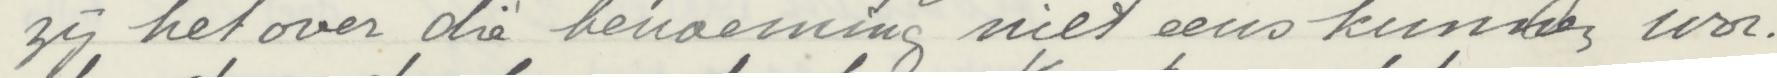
zij het over die benoeming niet eens kunnen wor
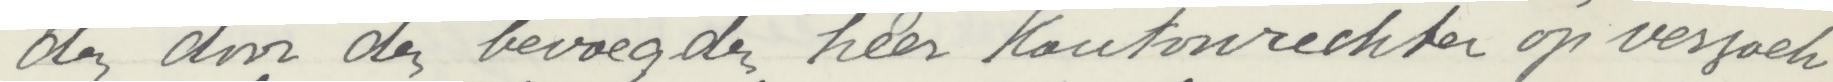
den door den bevoegden heer kantonrechter op verzoek
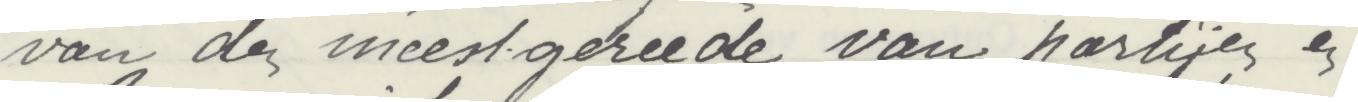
van den meestgereede van partijen en
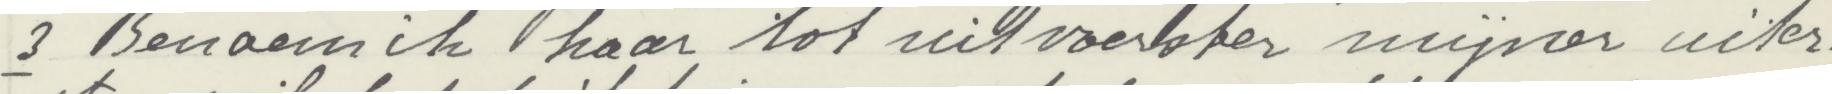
3 Benoem ik haar tot uitvoerster mijner uiter
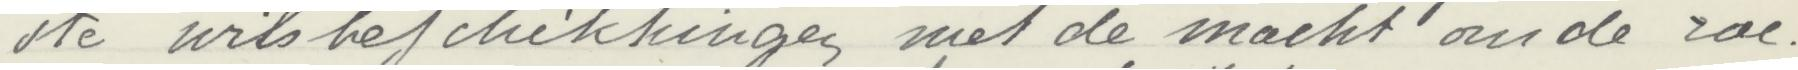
ste wils beschikkingen met de macht om de roe
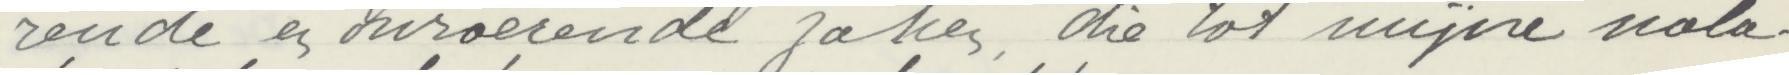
rende en onroerende zaken, die tot mijne nala
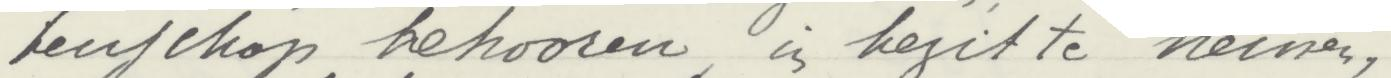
tenschap behooren, in bezit te neemen,
